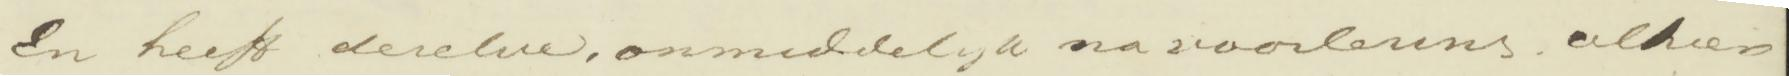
En heeft dezelve, onmiddelijk na voorlezing, alhier
